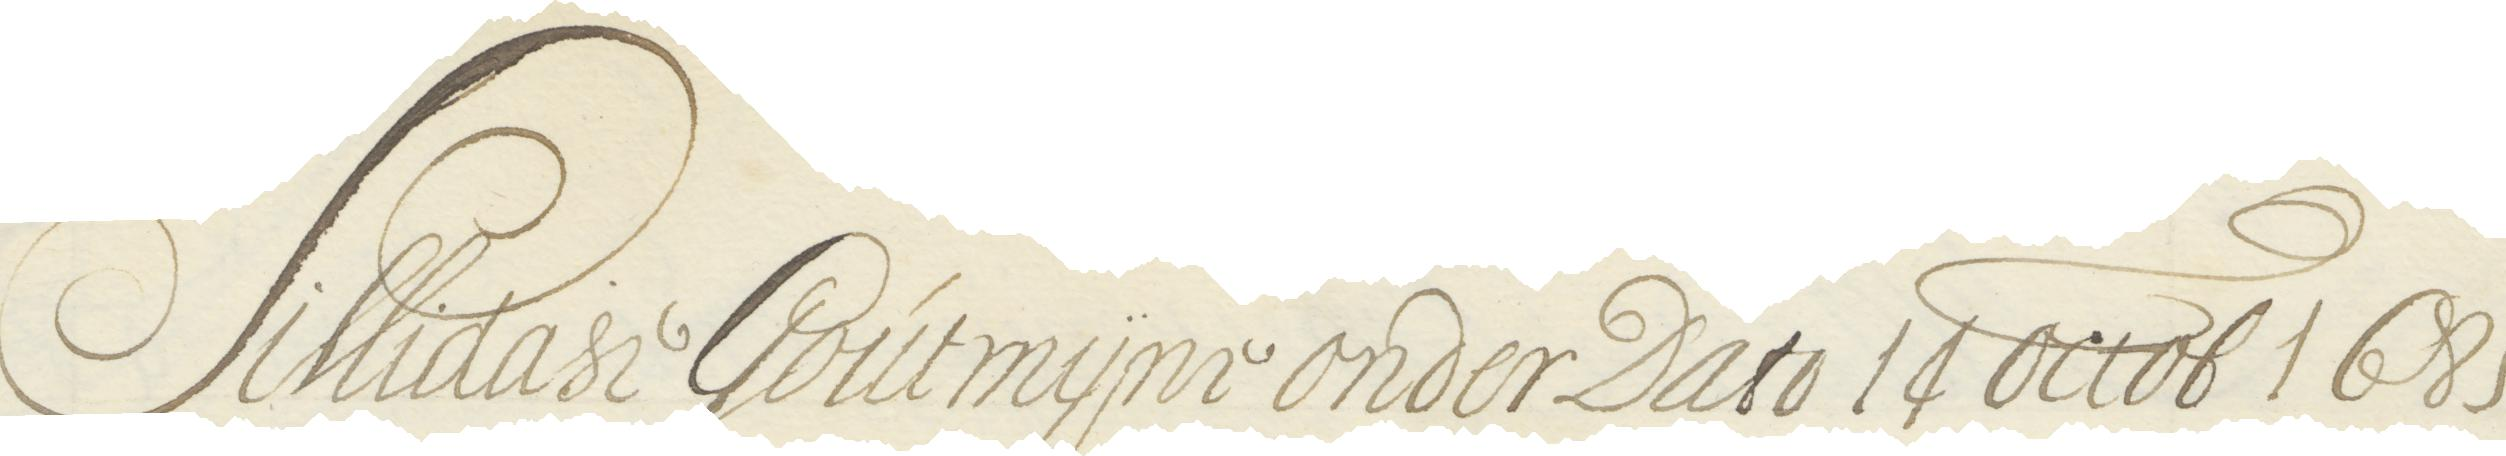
Sillidase Goutmijne onder Dato 14 octob 1685
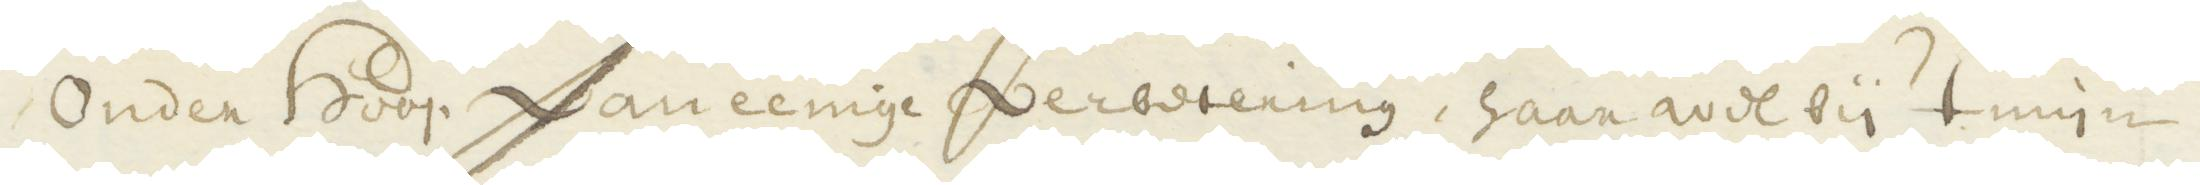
Onder Hoop van eenige verbetering, haar wel bij ’t mijn
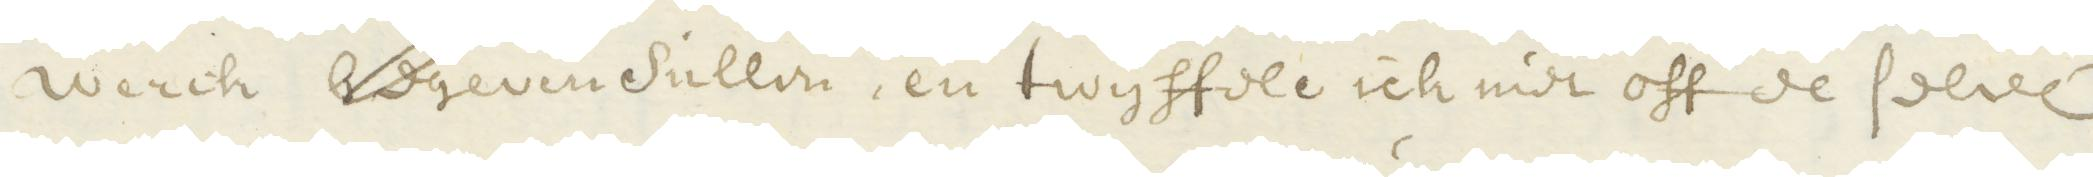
werck begeven sullen, en twijffele ick niet off de selve
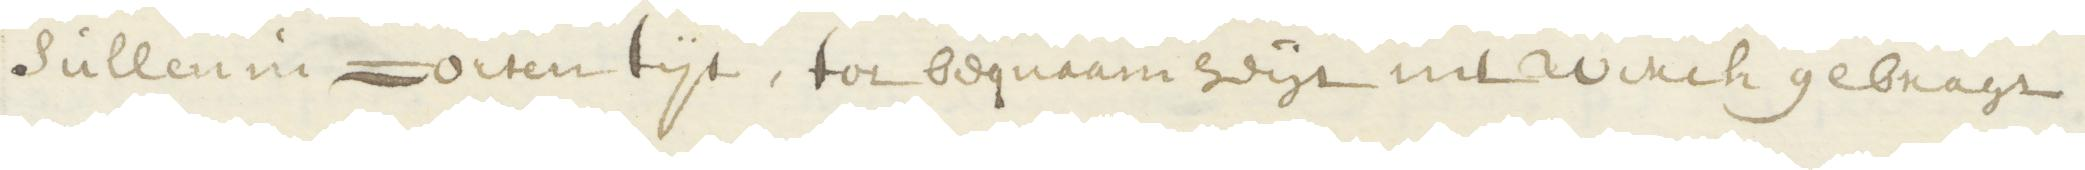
sullen in corten tijt, tot bequaamheijt int werck gebragt
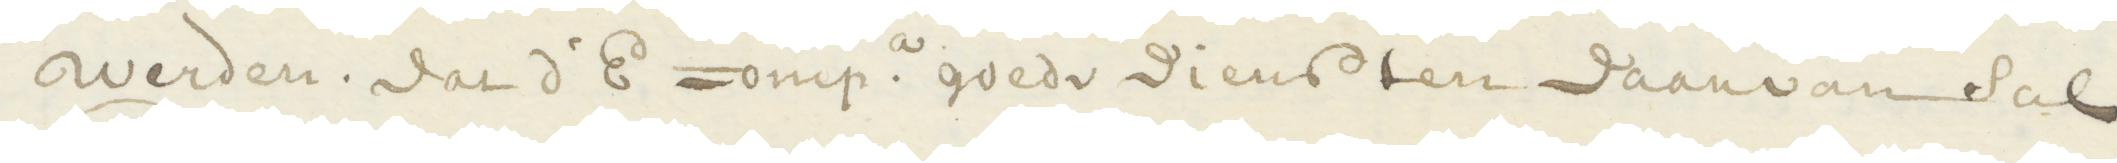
werden. dat d’ E comp.a goede diensten daarvan sal
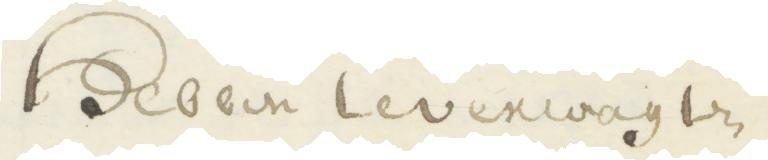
Hebben teverwagten
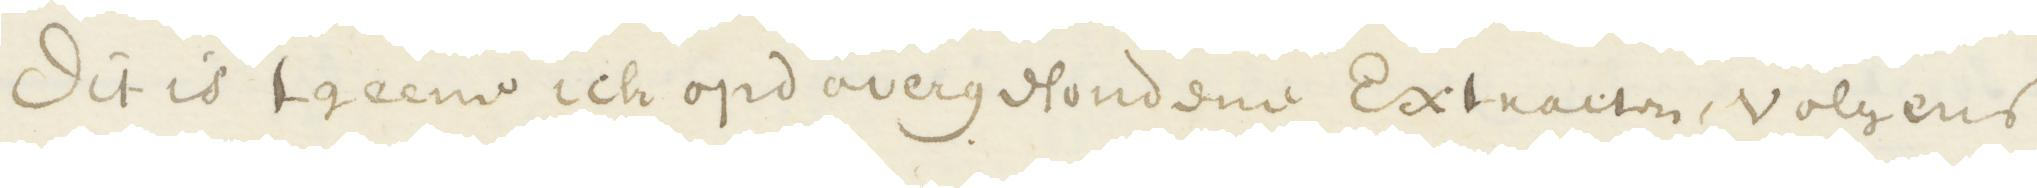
Dit is 't geene ick opd' overgesondene Extracten, volgens
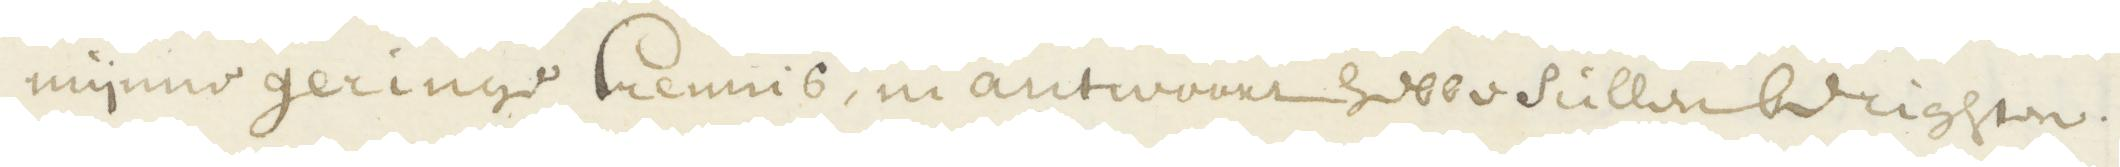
mijnne geringe kennis, in antwoort hebbe sullen berighten.
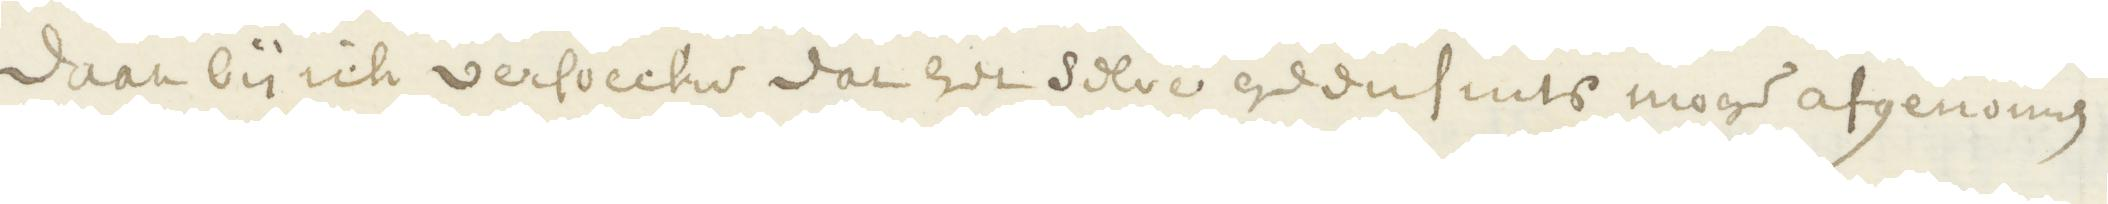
daar bij ick versoecke dat het selve geensints moge afgenomen
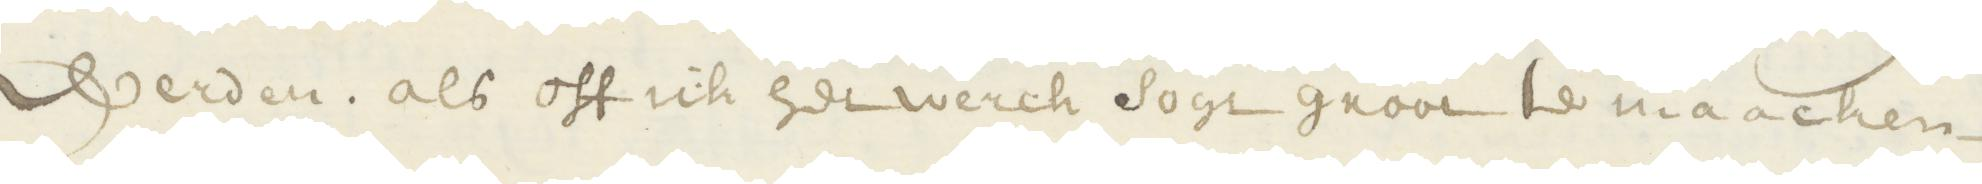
Werden. als off ick het werck sogt groot te maacken
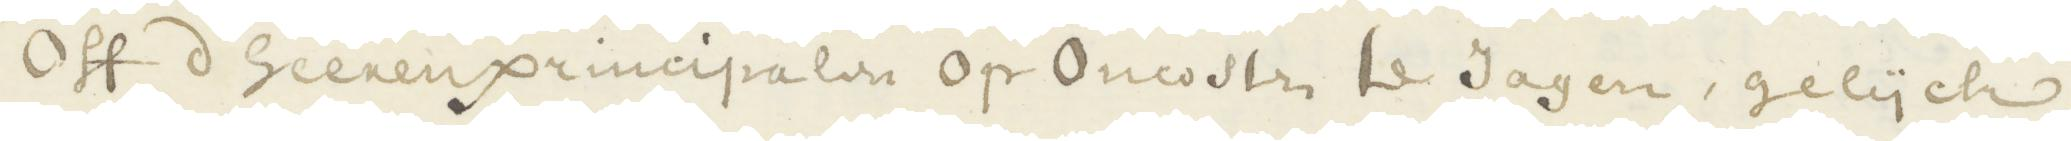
Off d' heeren principalen op Oncosten te jagen, gelijck
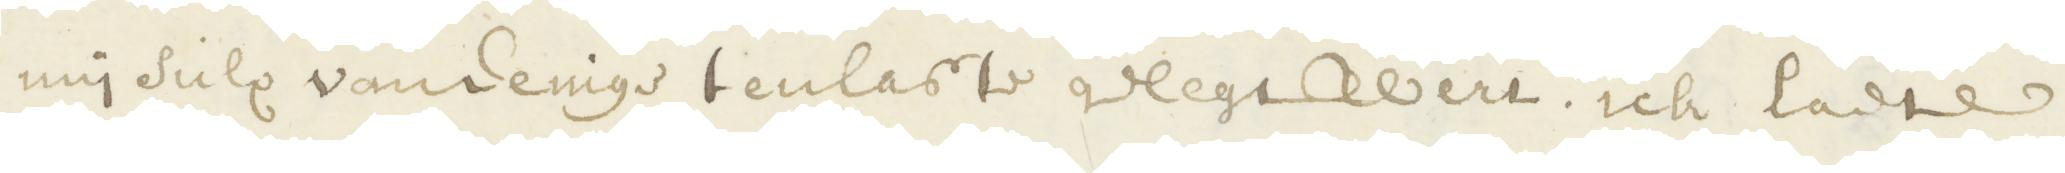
mij sulx van eenige tenlaste gelegt wert. ick laete
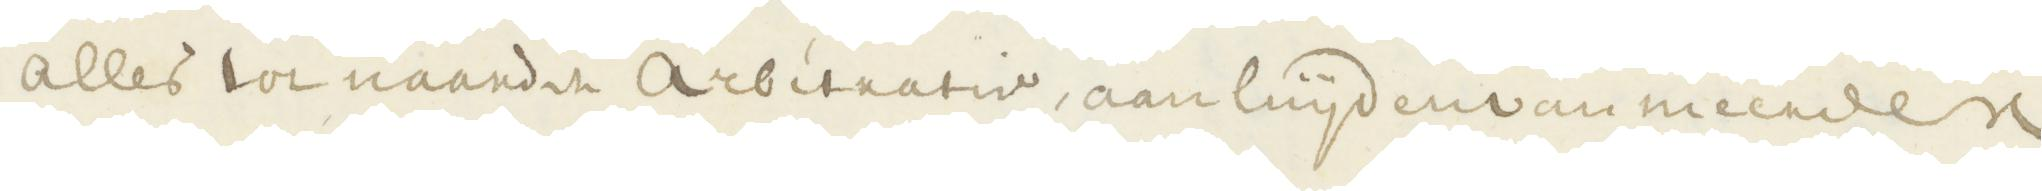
alles tot naarden arbitratie, aan luijden van meerder
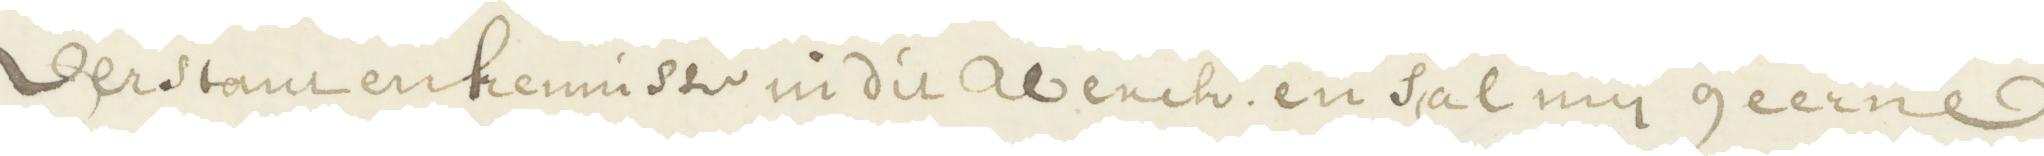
Verstant en kennisse in dit werck. en sal mij geerne
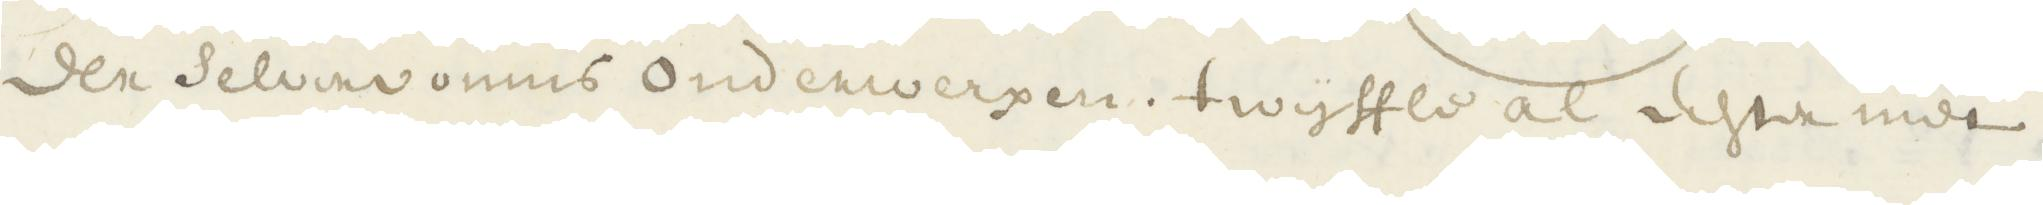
der selver vonnis onderwerpen. twijffle al echter niet
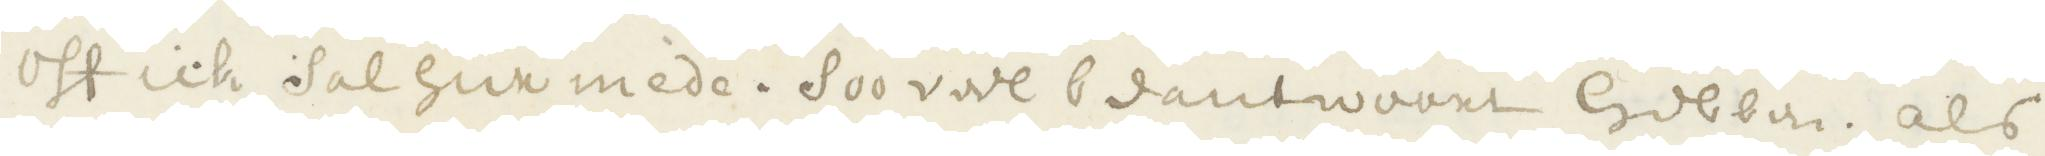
off ick sal hier mede. soo veel beantwoort hebben. als
